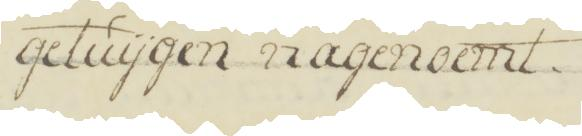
getuijgen nagenoemt.
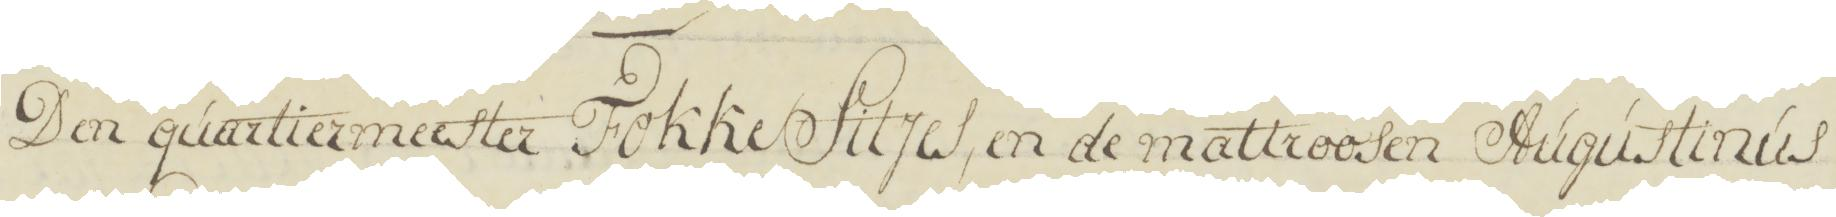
Den quartiermeester Fokke Sitjes, en de mattroosen Augustinus
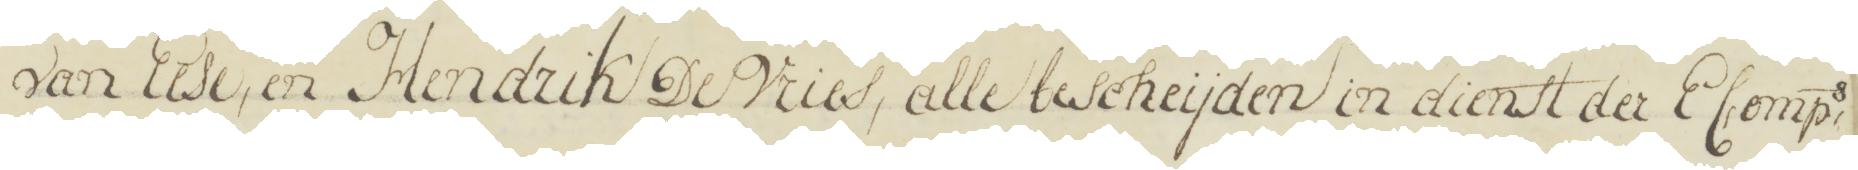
van Eese, en Hendrik De Vries, alle bescheijden in dienst der E Comp,s
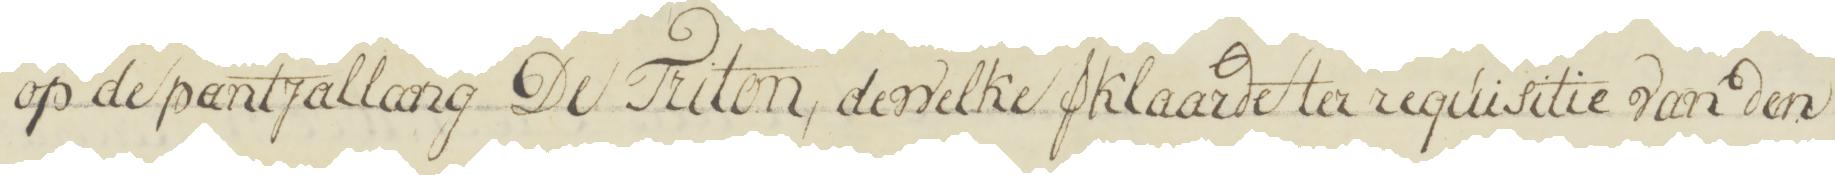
op de pantjallang De Triton, dewelke verklaarde ter requisitie van den
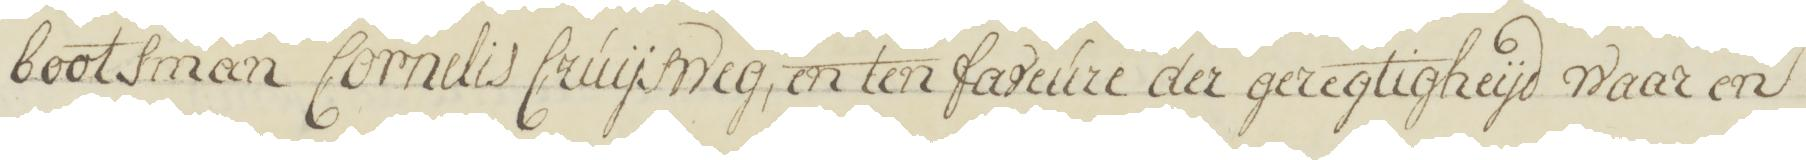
bootsman Cornelis Cruijsweg, en ten faveure der geregtigheijd waar en
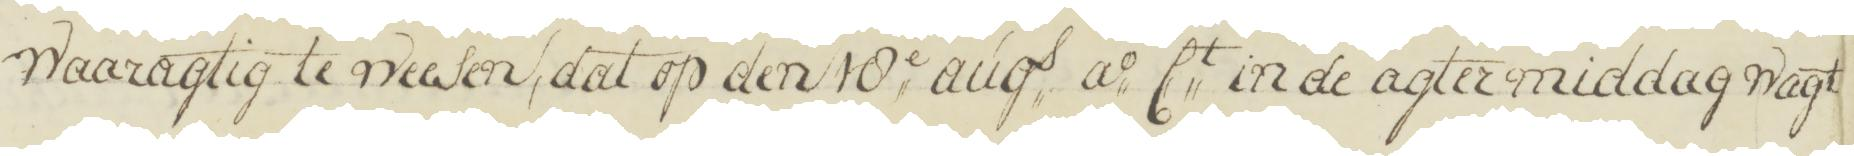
waaragtig te weesen, dat op den 18„e aug„s a„o C„t in de agtermiddag wagt
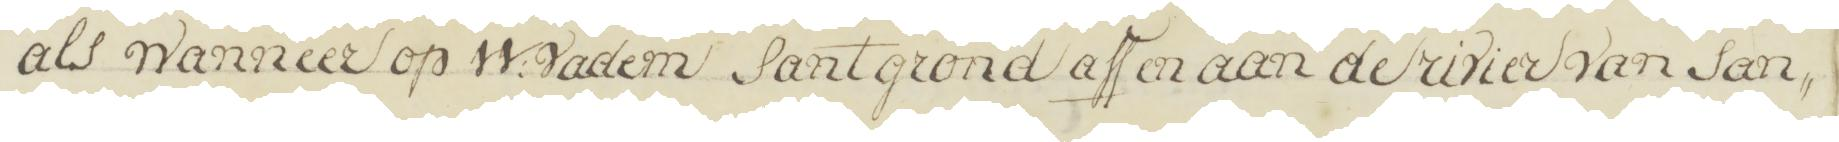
als wanneer op 11: vadem santgrond aff en aan de rivier van san„
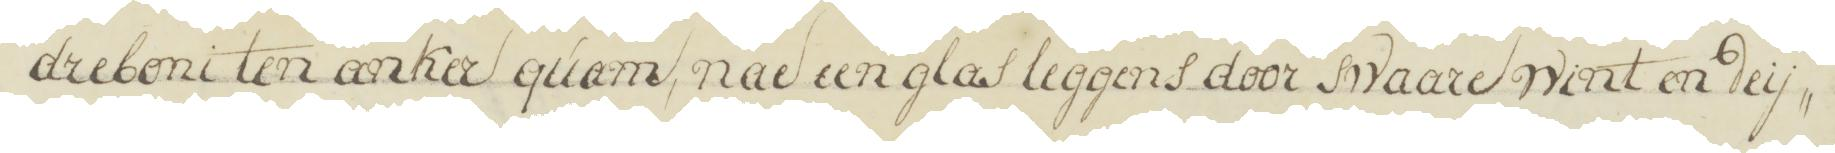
dreboni ten anker quam, nae een glas leggens door swaare wint en deij„
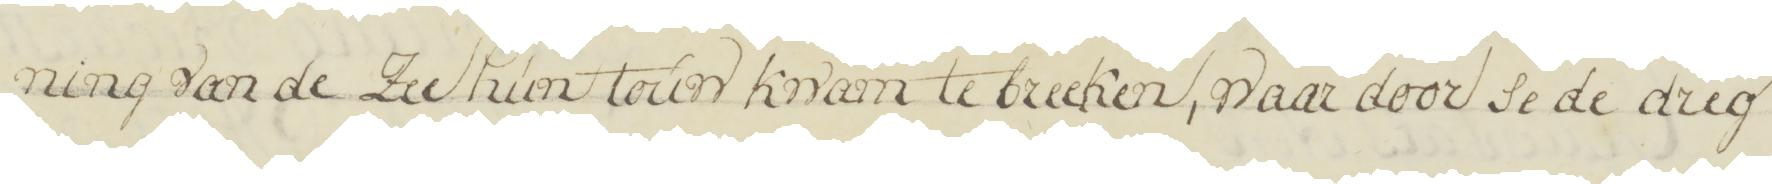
ning van de zee hun touw kwam te breeken, waar door se de dreg
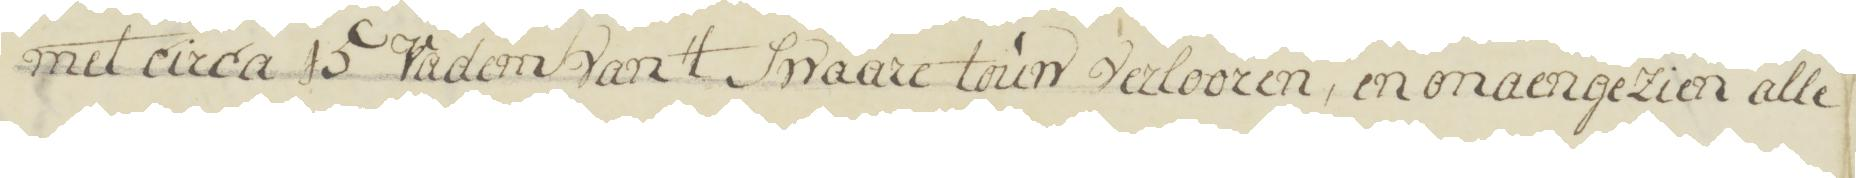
met circa 15 vadem van ’t swaare touw verlooren, en onaengezien alle
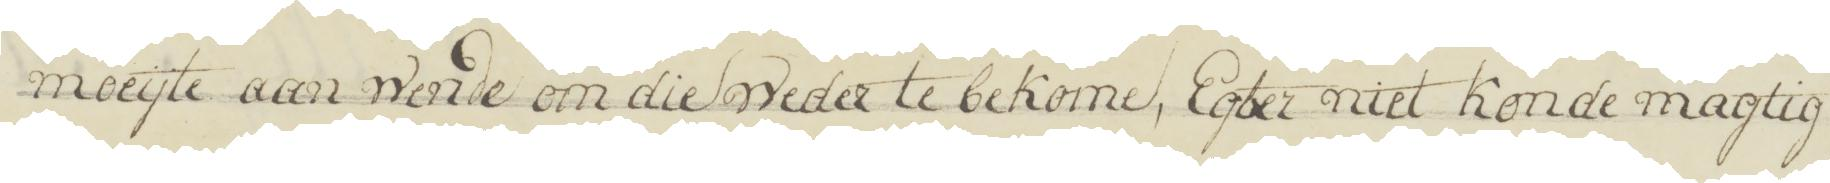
moeijte aan wende om die weder te bekome, Egter niet konde magtig
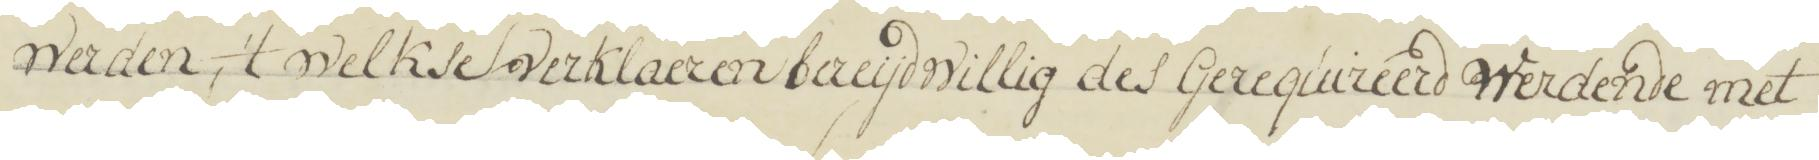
werden, ’t welk se verklaeren bereijdwillig des Gerequireerd werdende met
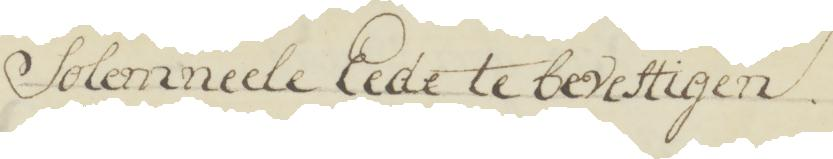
Solemneele Eede te bevestigen.
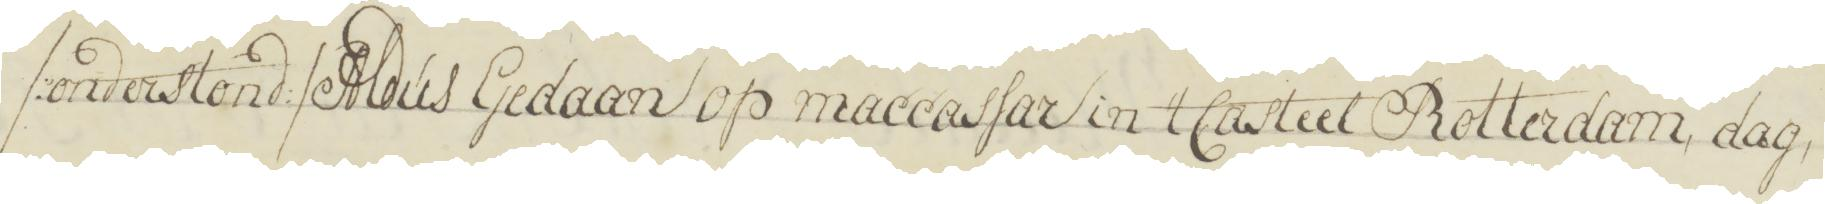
/:onderstond:/ Aldus Gedaan op maccassar in ’t Casteel Rotterdam, dag,
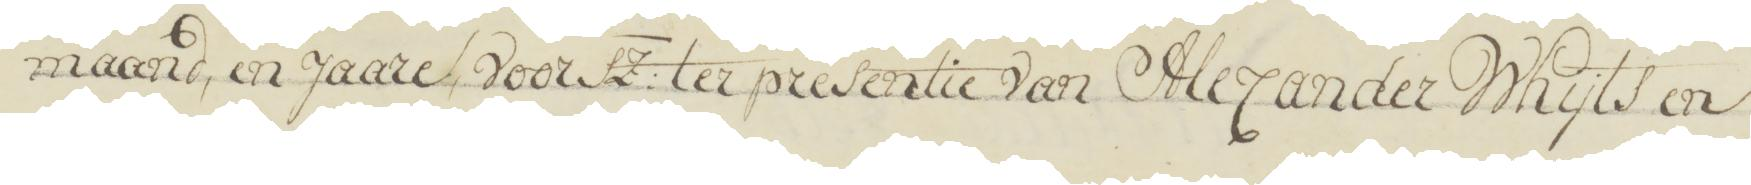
maand, en jaare, voorsz: ter presentie van Alexander Whijts en
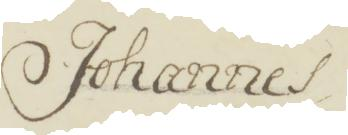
Johannes
